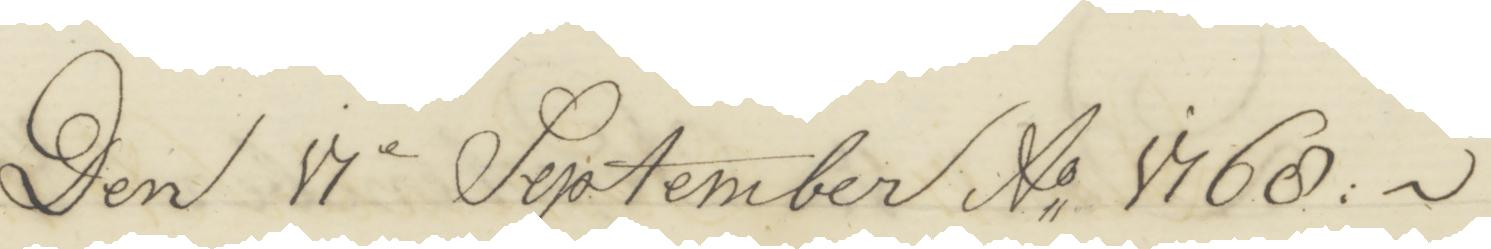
Den 17e September A„o 1768:
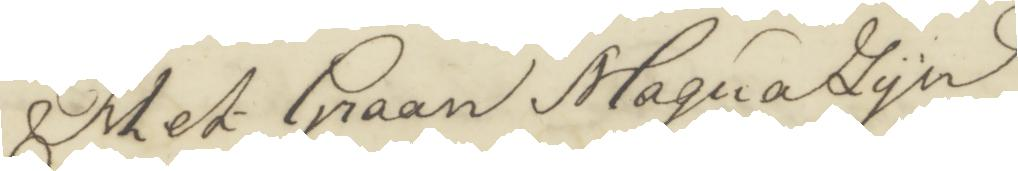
Met Graan Maguazijn
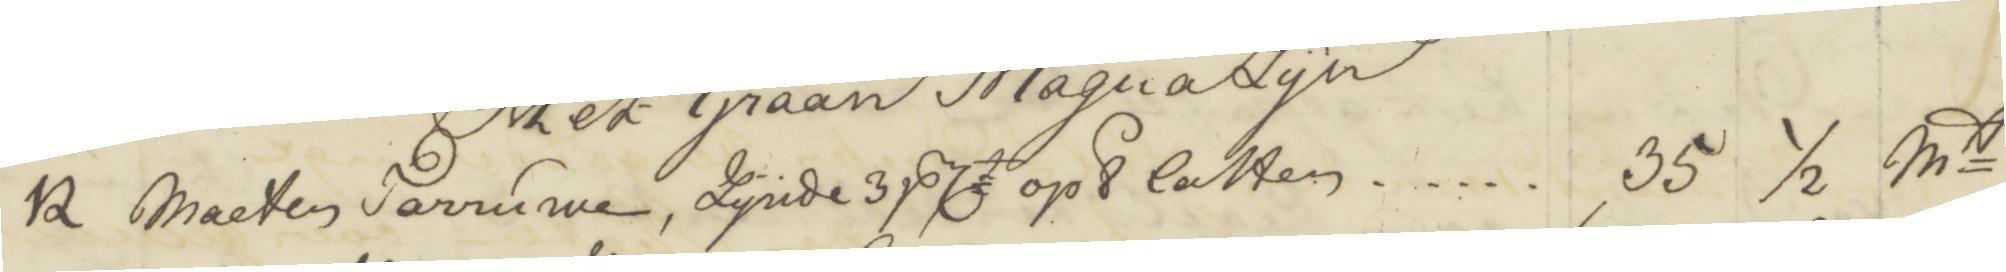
12 maeten Tarruwe, zijnde 3 prC=t op 8 lasten . . . . . 35 ½ m=t
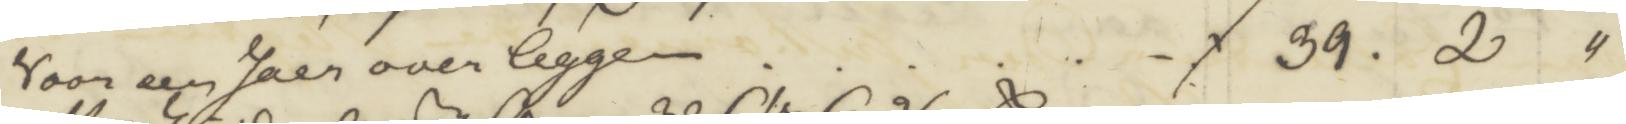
Voor een Jaer over leggen . . . . . - ƒ 34. 2
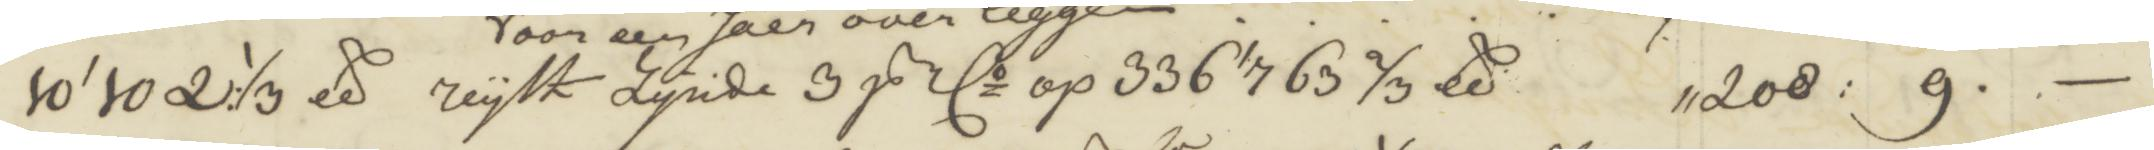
10' 10 2:1/3 ed reijst zijnde 3 prC=o op 336'7 63 2/3 ed „208: 9. —
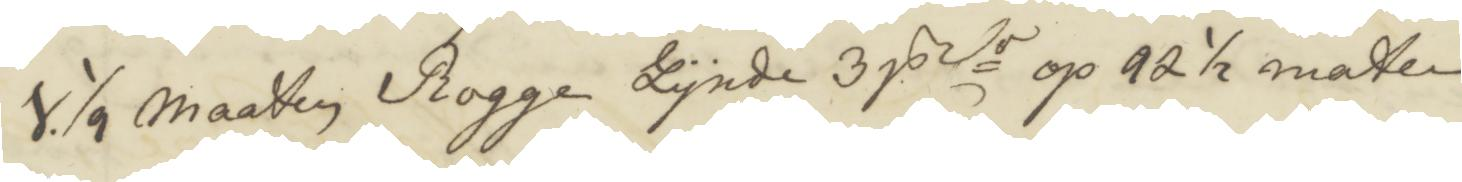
1.1/4 maaten Rogge zijnde 3 prC=o op 42½ maten
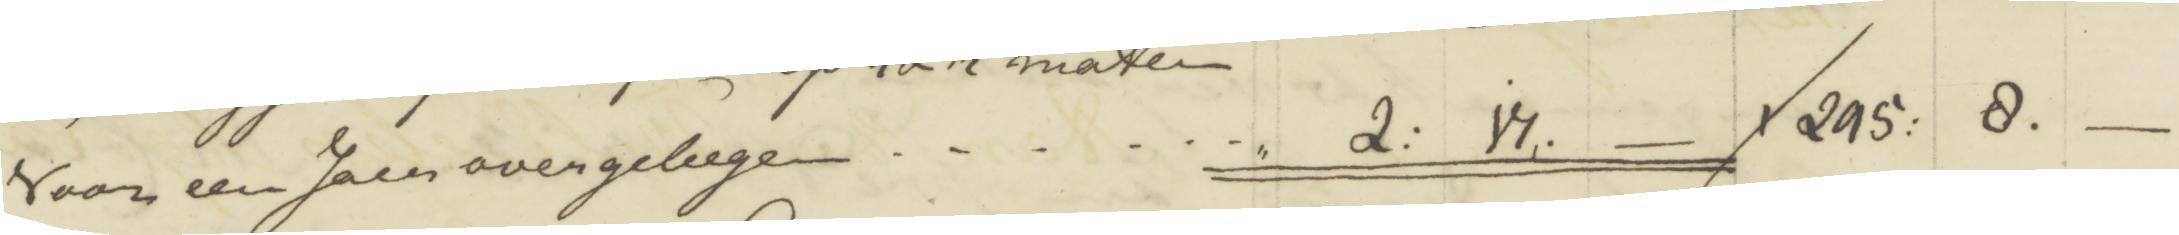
voor een Jaer overgeleegen . . . . . . „ 2: 17: — ƒ245: 8. —
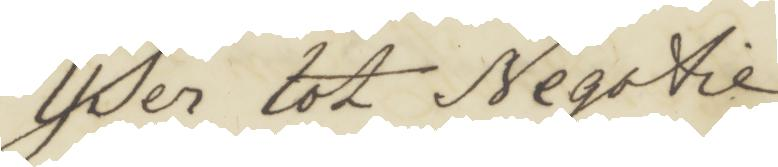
IJser tot Negotie
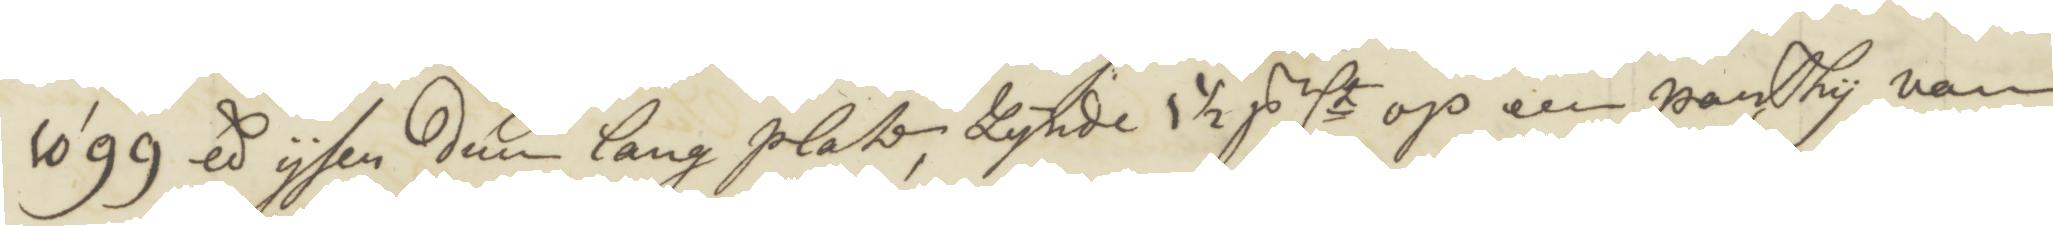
10'99 ed ijser dun lang plate, zijnde 1½ prC=t op een parthij van
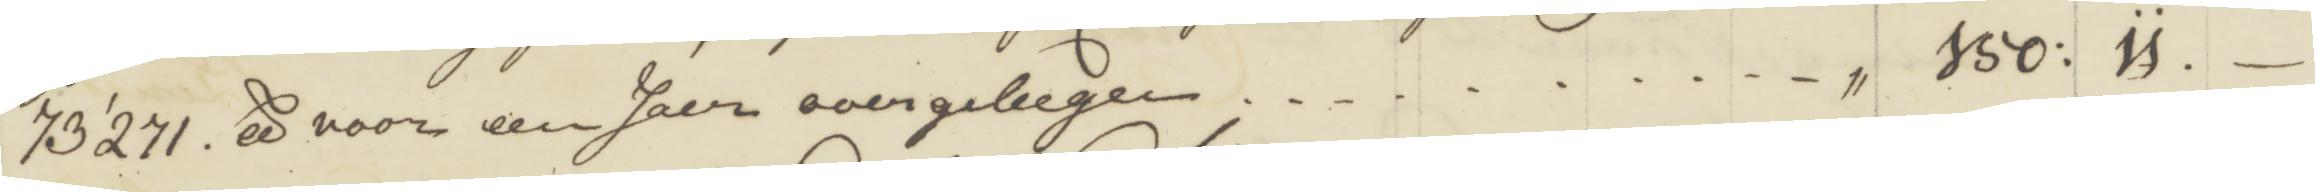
73'271. ed voor een Jaer overgeleegen . . . . . . . . . - „150: 11. —
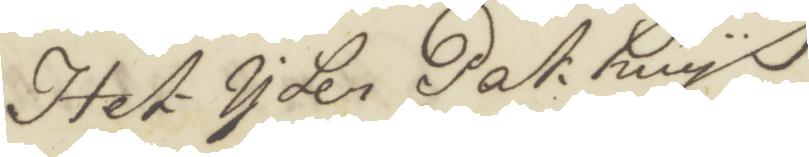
Het IJser Pakhuijs
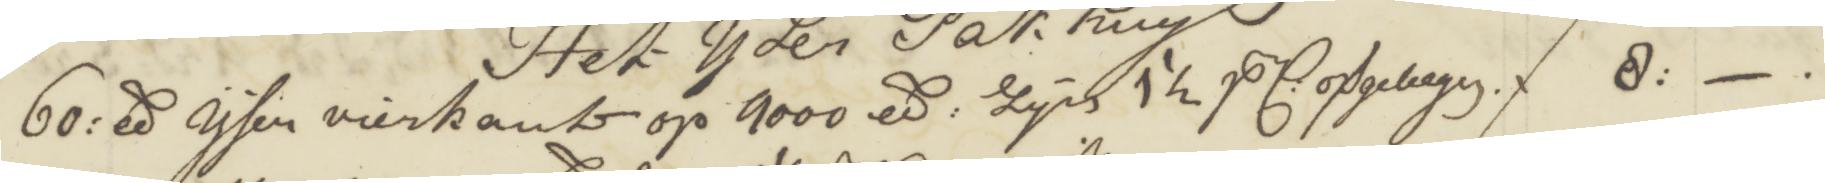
60: ed ijser vierkant op 4000 ed: zijn 1½ prc: overgeleegen. ƒ 8: — .
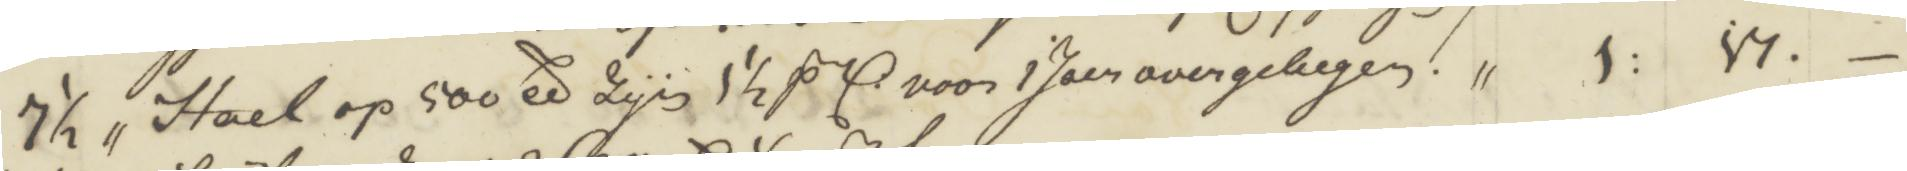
7½ „ stael op 500 ed zijn 1½ prC: voor 1 Jaer overgeleegen. „ 1: 17. —
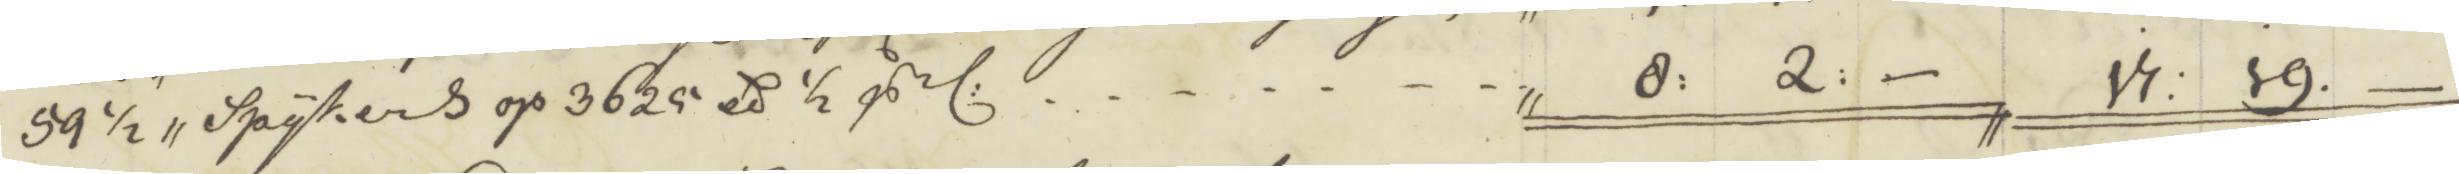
54½ „ spijkers op 3625 ed ½ prC: - - - - - - - „ 8: 2: — „ 17: 19. —
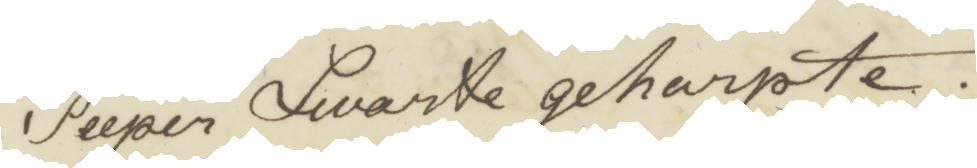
Peeper Swarte geharpte.
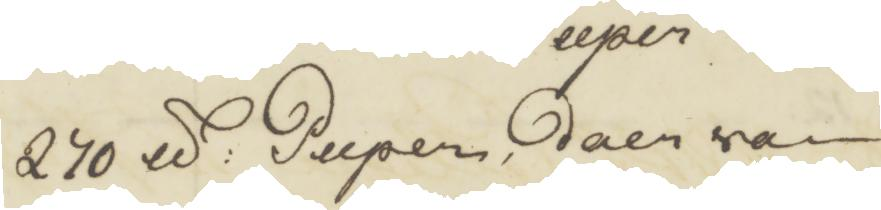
270 ed: Peeper, daer van
